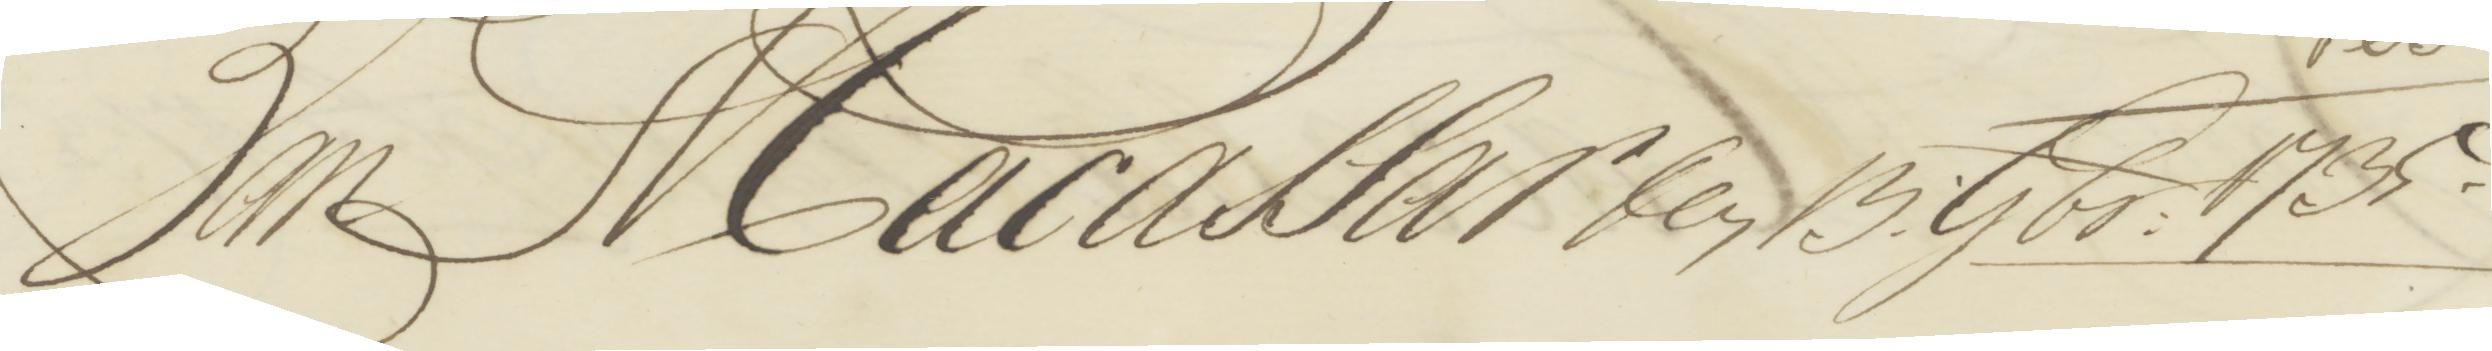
Van Macassar den 13: 9br: 1735.
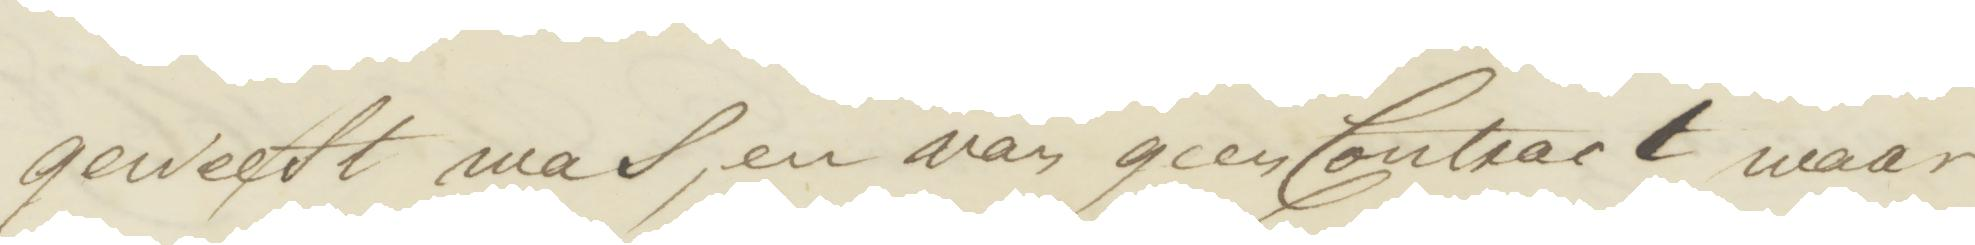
geweest was, en van geen Contract waar
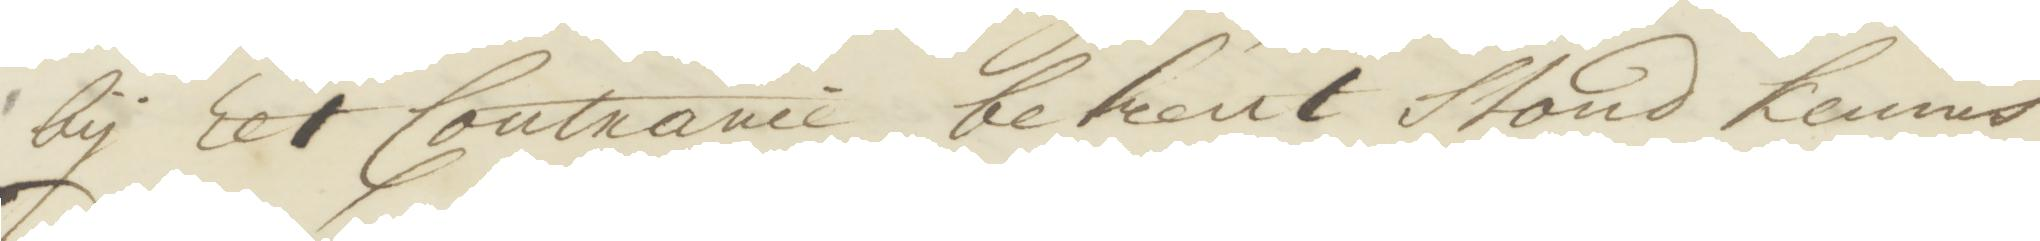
bij het Contrarie bekent stond kennis
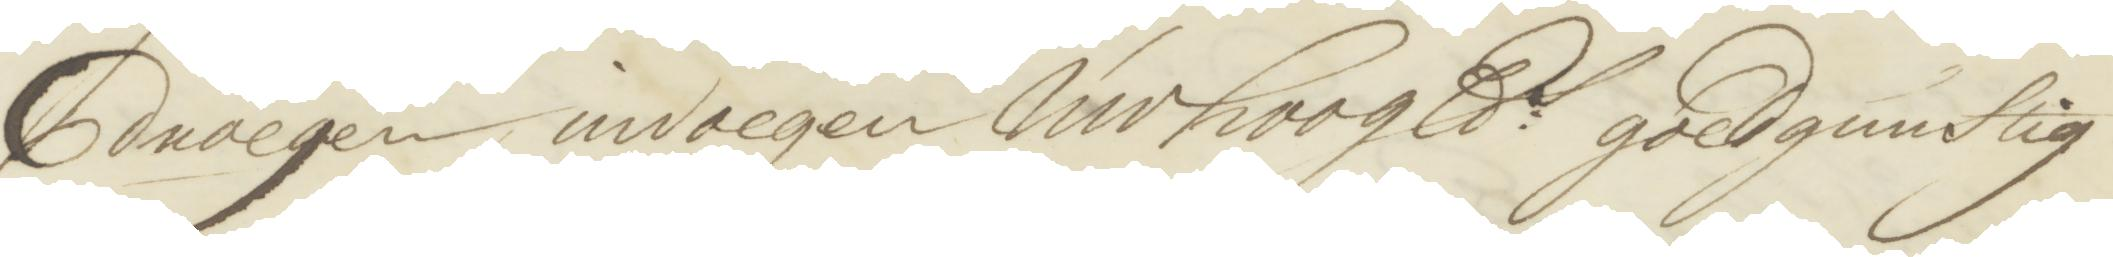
droegen, invoegen uw hoog Ed:s goed gunstig
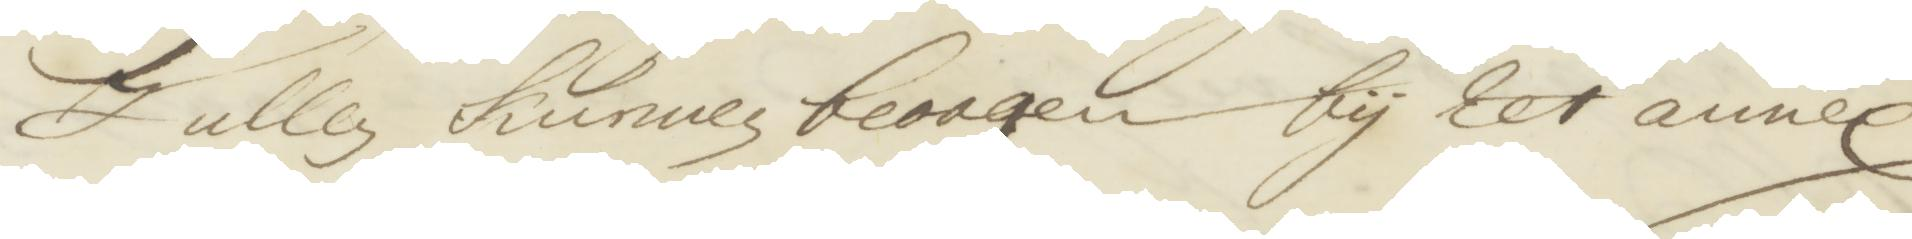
zullen kunnen beoogen bij het annex
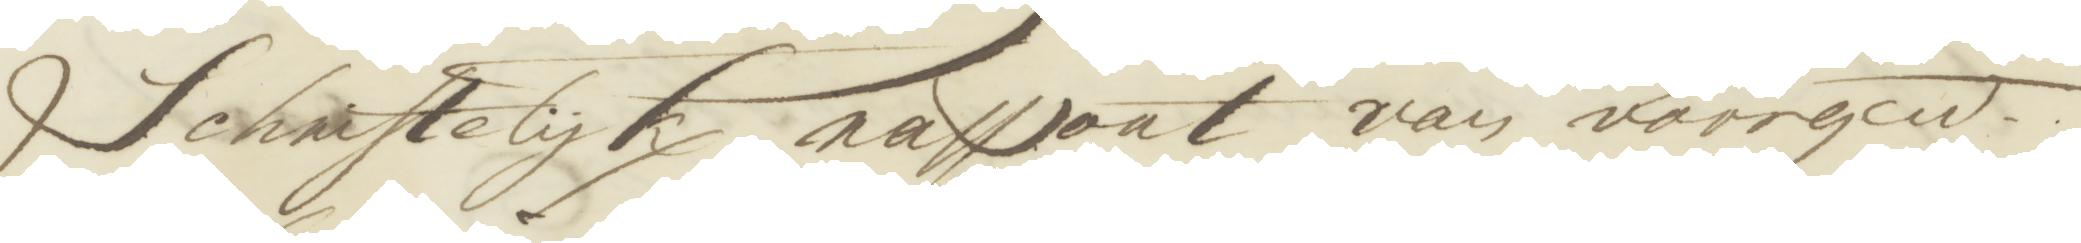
schriftelijk rapport van voorgen:
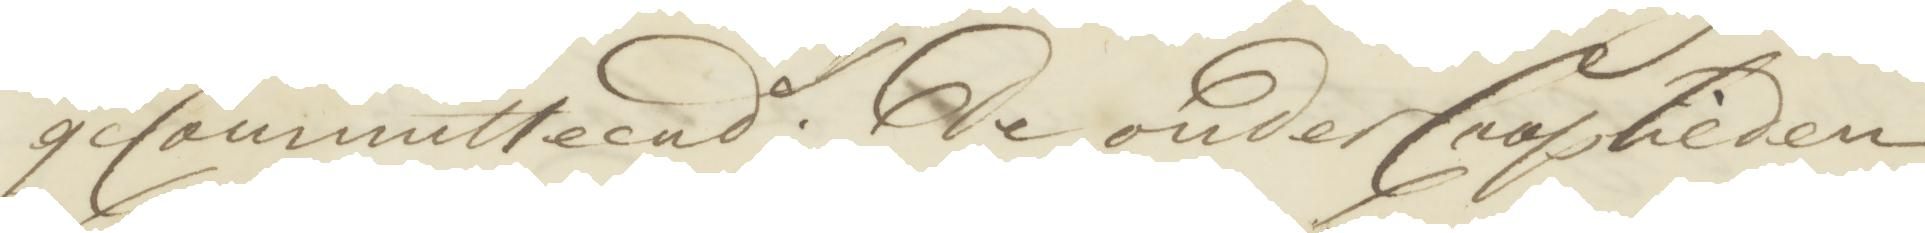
gecommitteerd:s de ondercooplieden
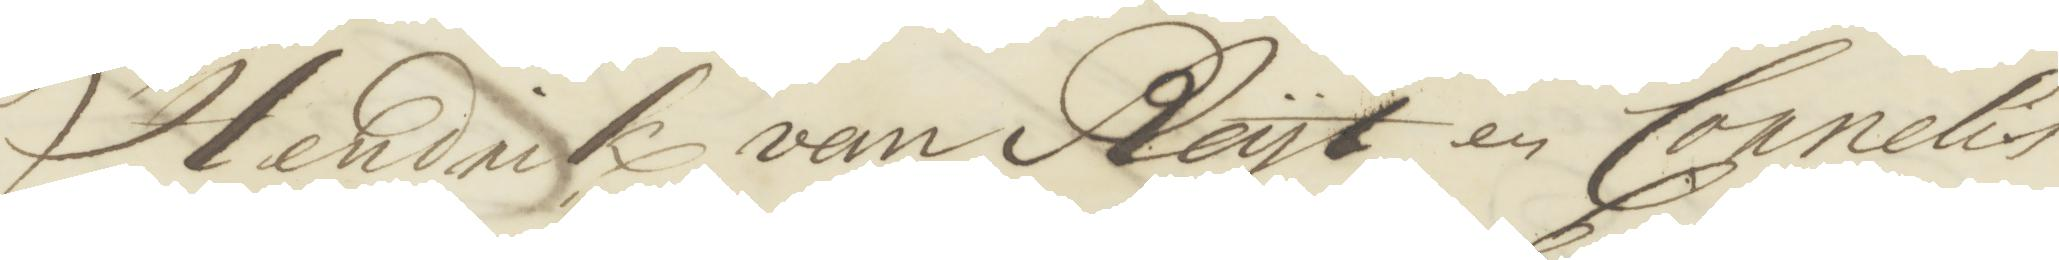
Hendrik van Reijt en Cornelis
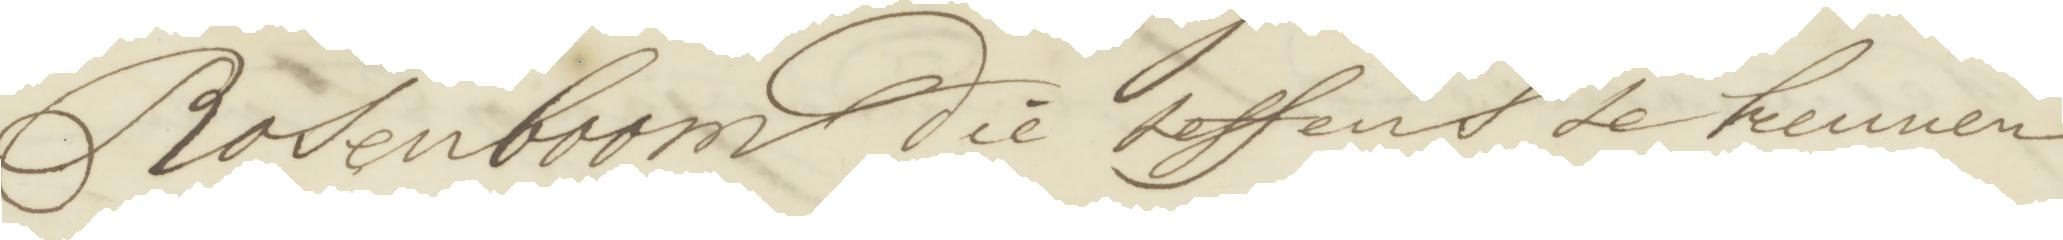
Rosenboom die teffens te kennen
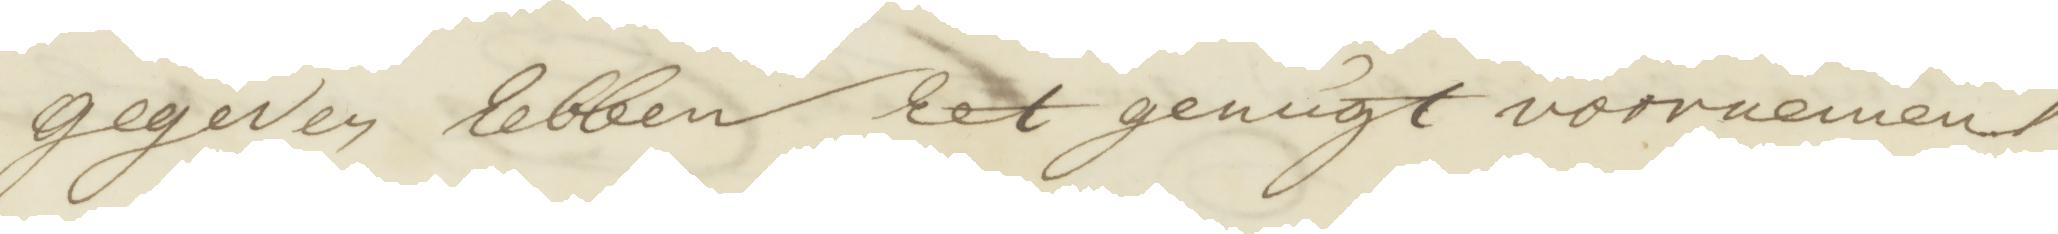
gegeven hebben het gerugt voornemens
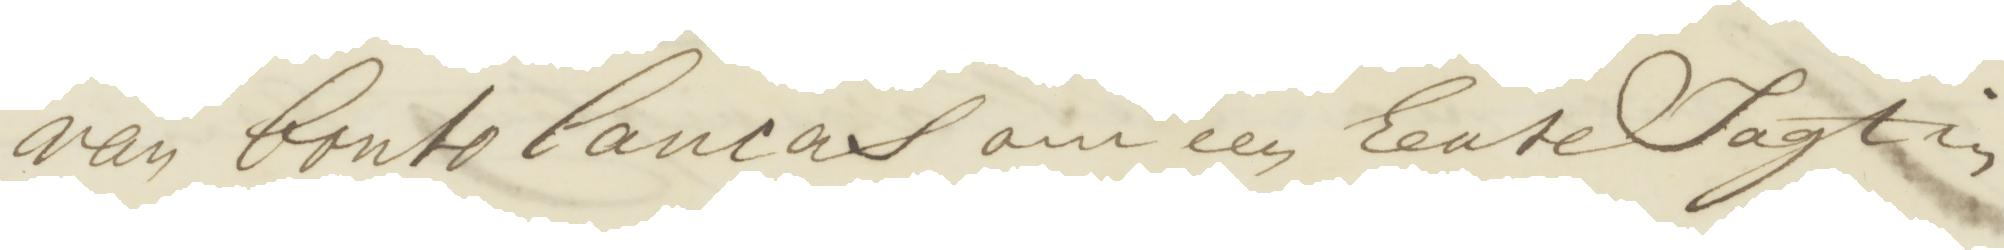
van bonto lancas om een herte sagt in
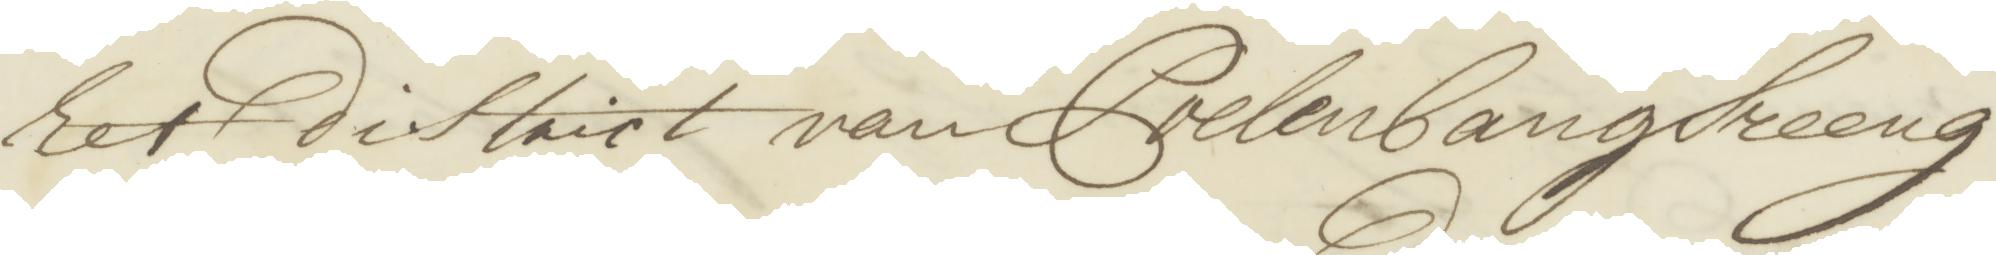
het district van Poelenbangskeeng
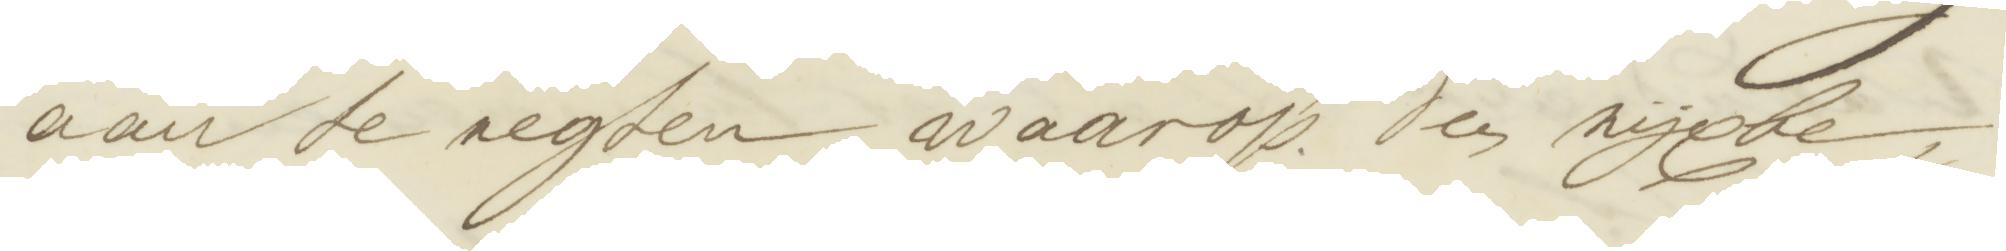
aan te regten, waar op den rijxbe„
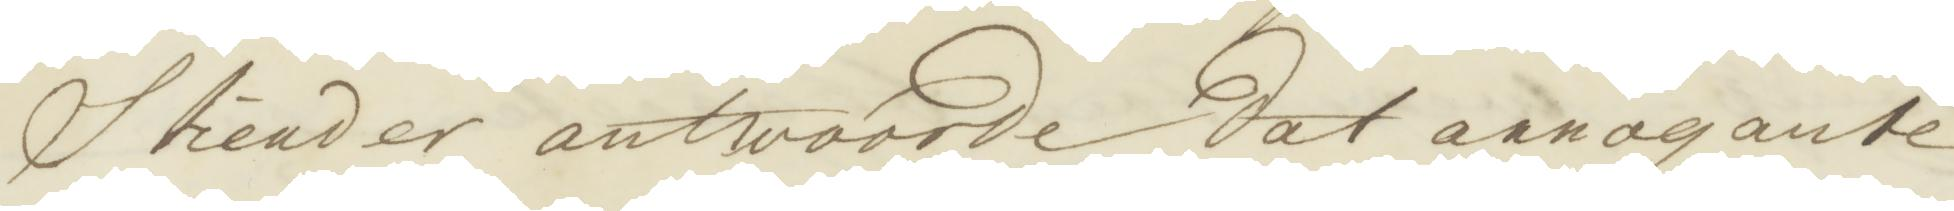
stierder antwoorde dat arrogante
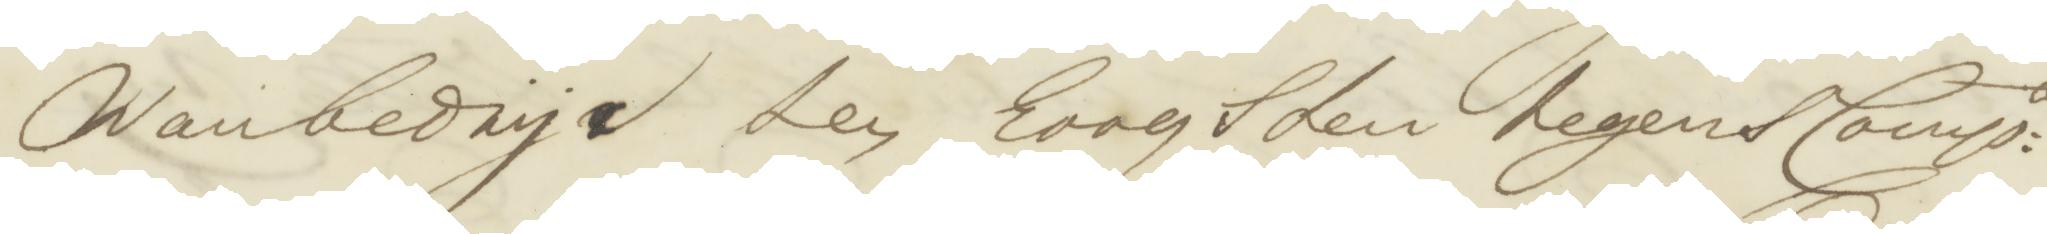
wanbedrijv ten hoogsten tegens Comp:s
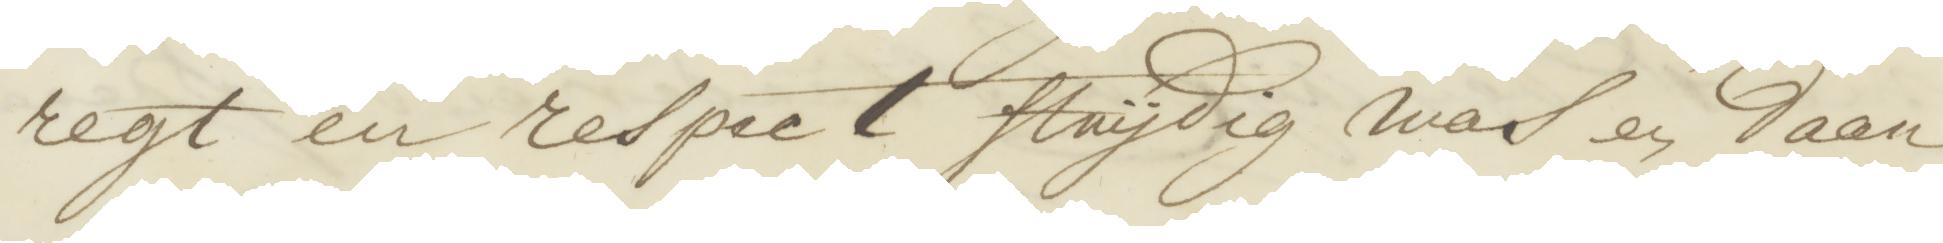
regt en respect strijdig was en daar
